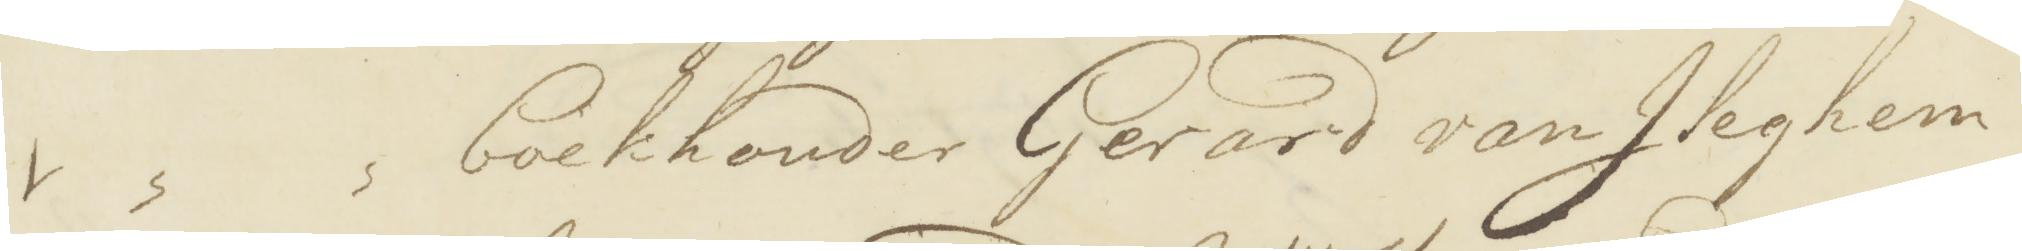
1 „ „ boekhouder Gerard van Jseghem
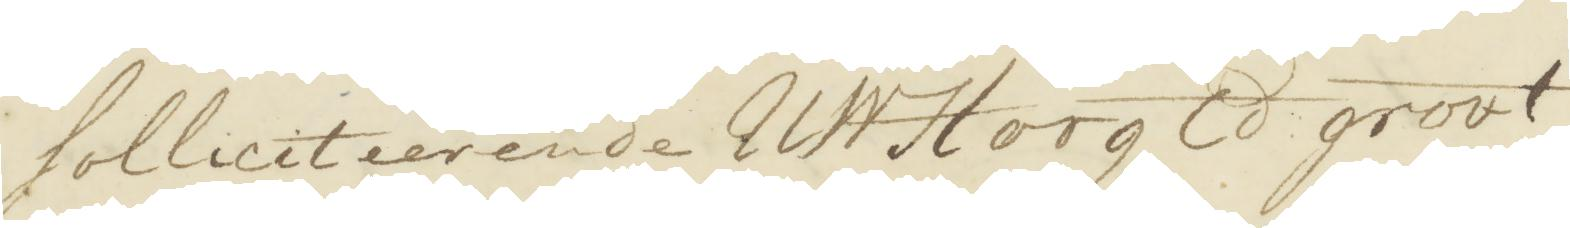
solliciteerende UWHoog Ed: groot
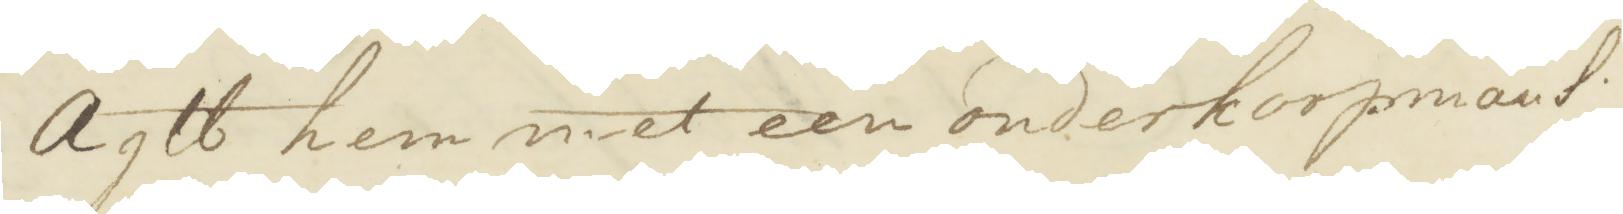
Agtb hem met een onderkoopmans
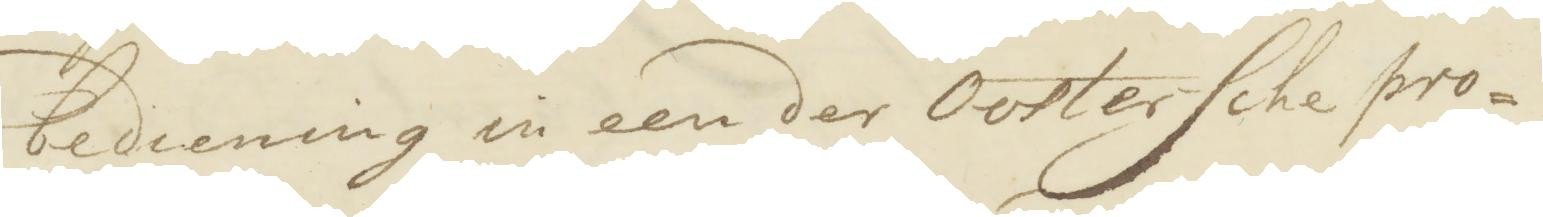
bediening in een der Oostersche pro„
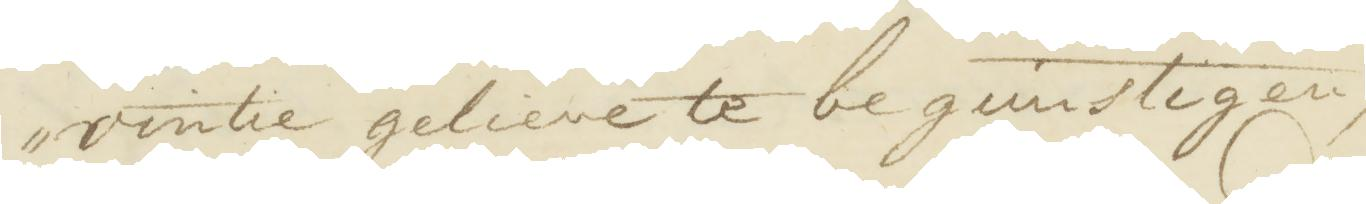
„vintie gelieve te begunstigen,
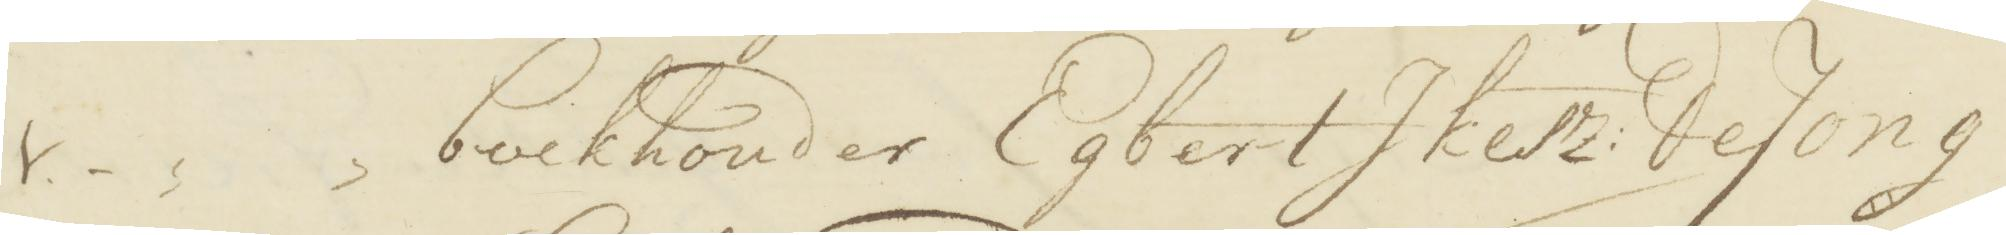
1. - „ „ boekhouder Egbert Jkesz: de Jong
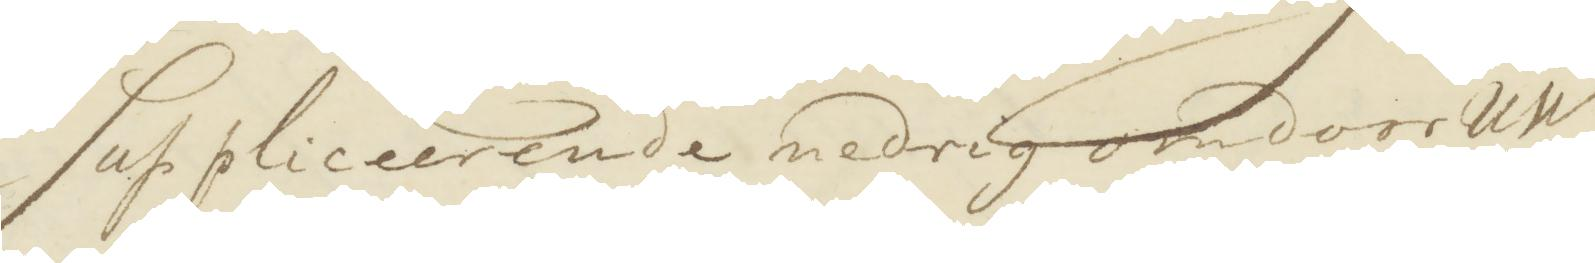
suppliceerende nedrig om door UW
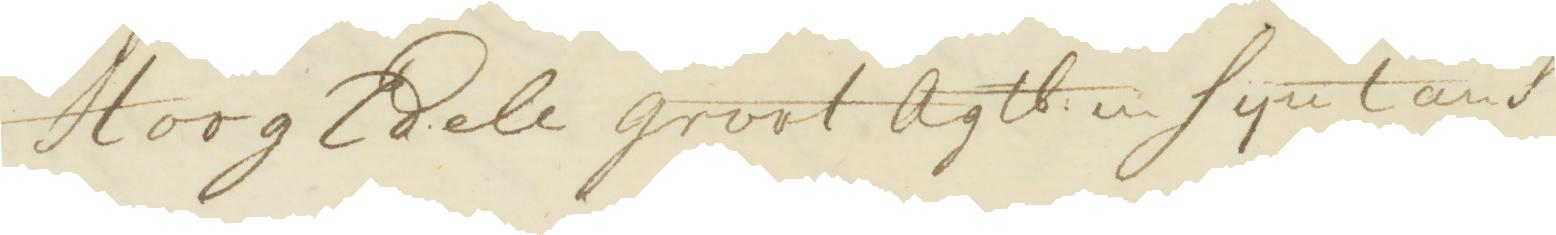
Hoog Edele groot Agtb: in sijn tans
